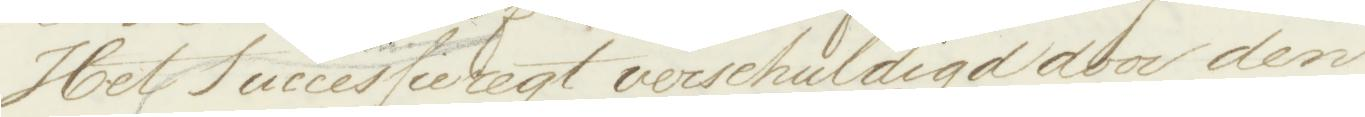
Het Successieregt verschuldigd door den
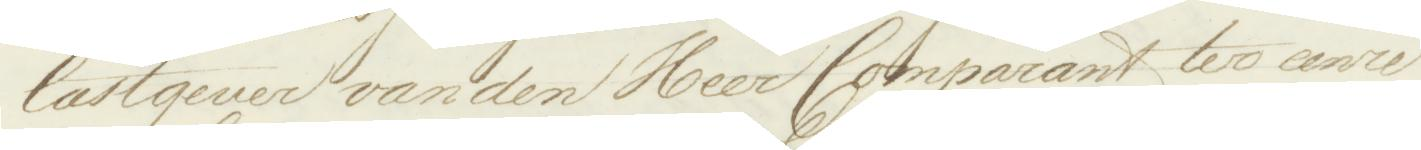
lastgever van den Heer Comparant ter eenre
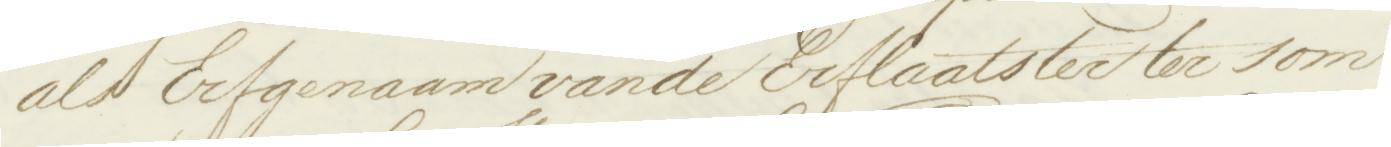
als Erfgenaam vande Erflaatster ter som
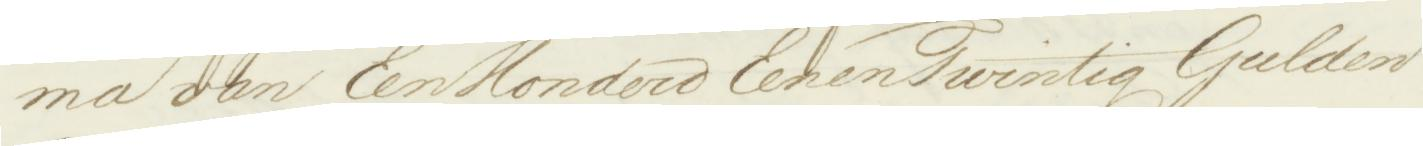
ma van Een Honderd Een en Twintig Gulden
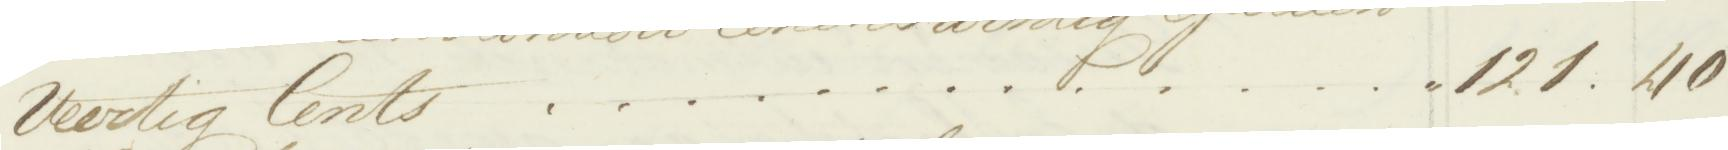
Veertig Cents , - . . - - . . . . . . . „12.1. 40
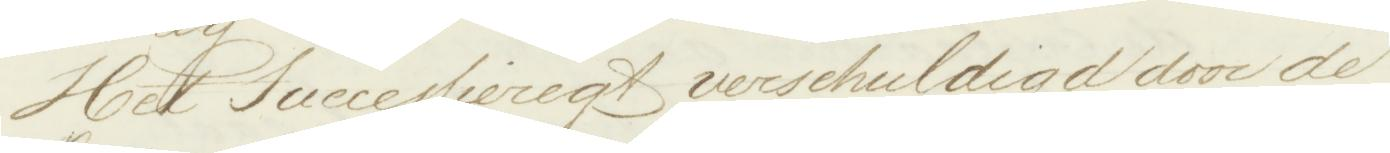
Het Successieregt verschuldigd door de
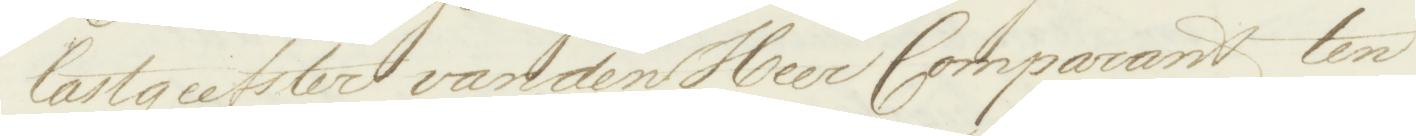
lastgeefster van den Heer Comparant ten
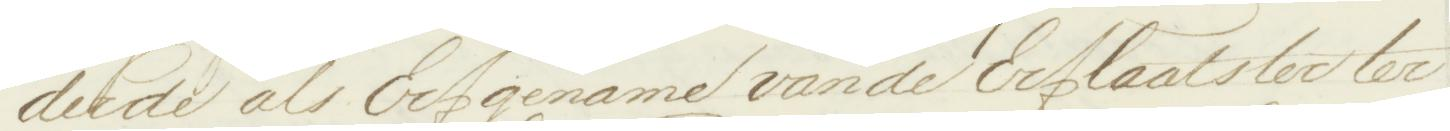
derde als Erfgename van de Erflaatster ter
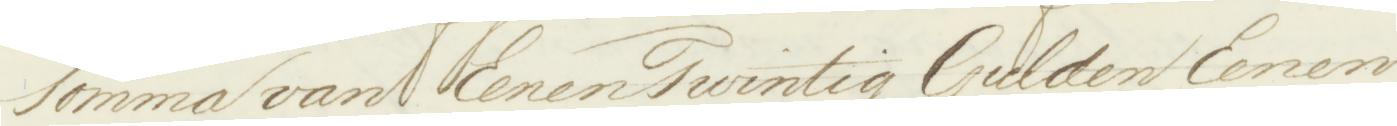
somma van Eenen Twintig Gulden Eenen
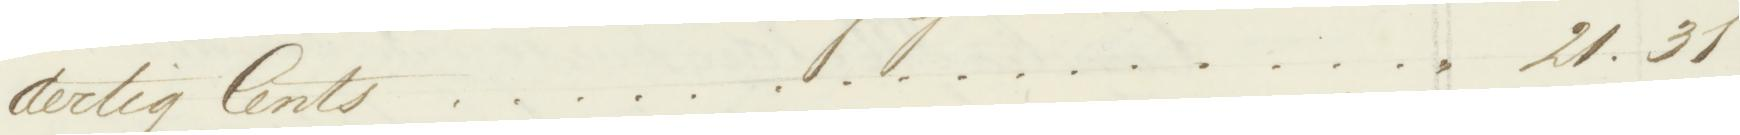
dertig Cents . . . . . . . . . . . . . . . . „ 21.31
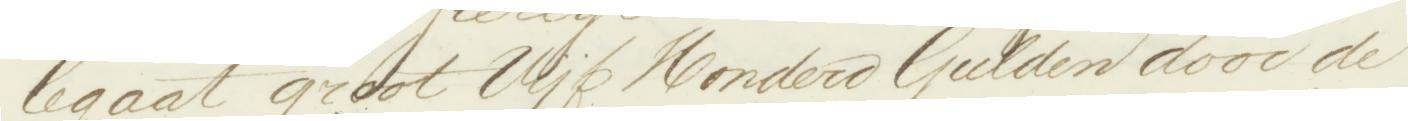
legaat groot Vijf Honderd Gulden door de
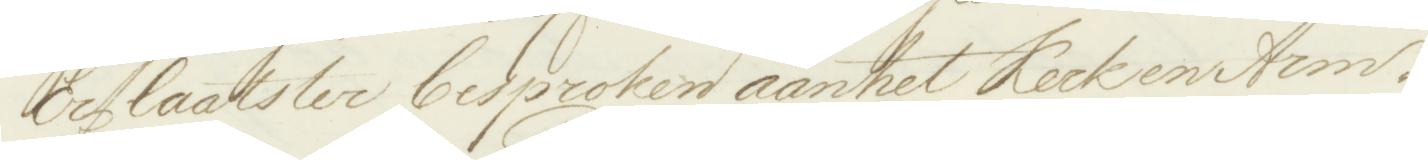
Erflaatster besproken aan het Kerk en Arm„
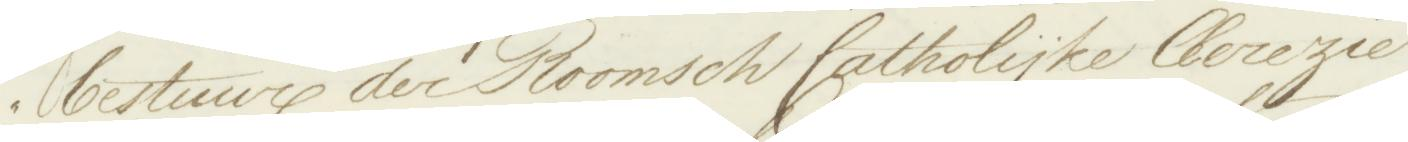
„bestuur der Roomsch Catholijke Clerezie
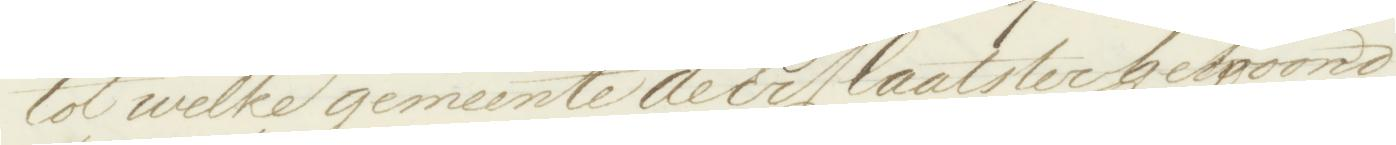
tot welke gemeente de Erflaatster behoord
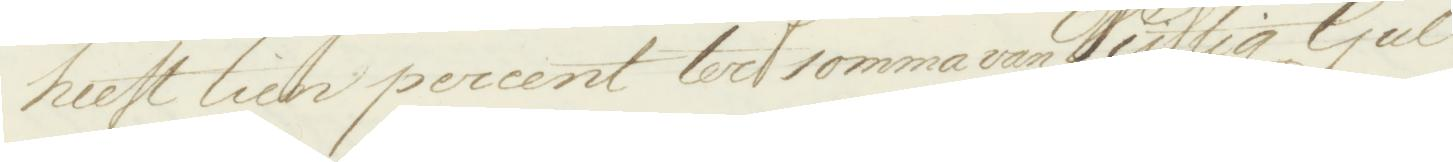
heeft tien percent ter somma van Vijftig Gul
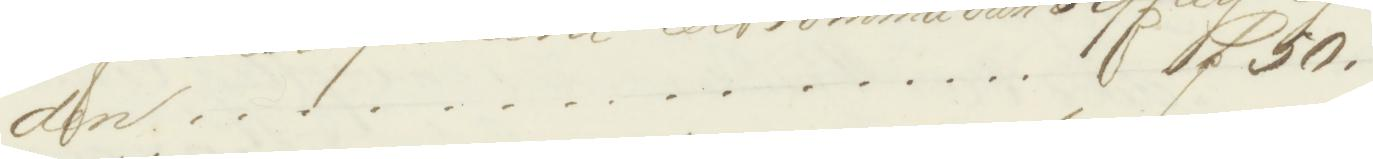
den . . . . . . . . . . . . . . . . ƒ 50.
